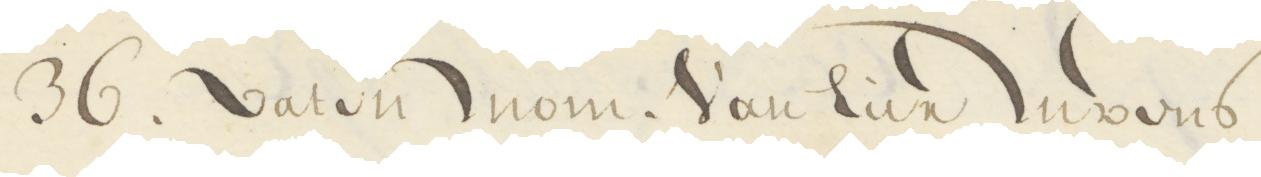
36. vaten mom. van hier nevens
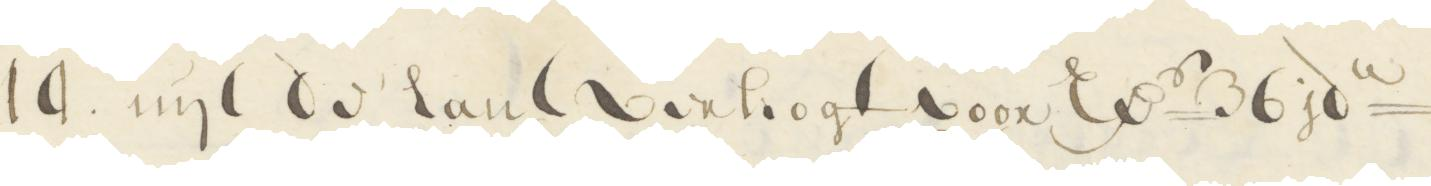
14. uijt de hant verkogt voor RE=s 36 jd=e
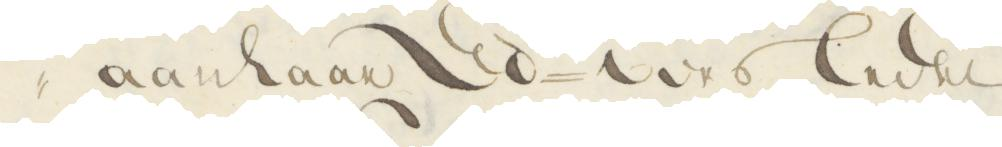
„ aan haar Ed=s verstrekt
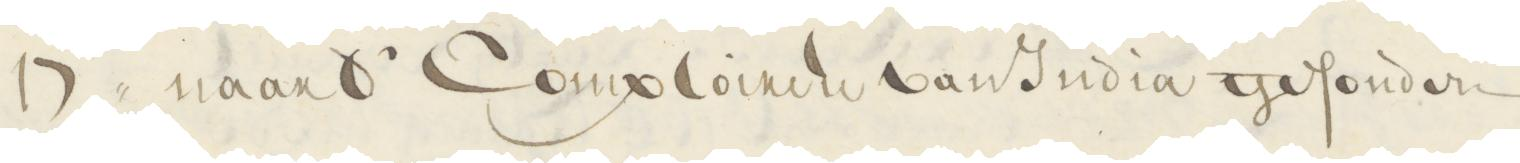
17 „ naar d’ Comptoiren van India gesonden
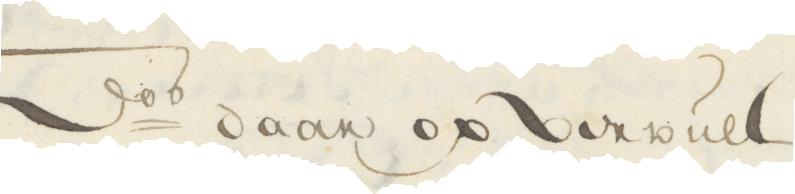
D=os daar op vervult
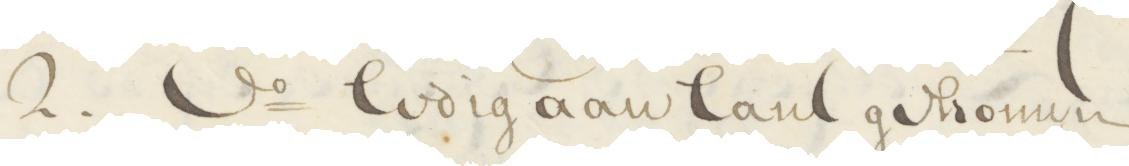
2 . D=o ledig aan lant gekomen
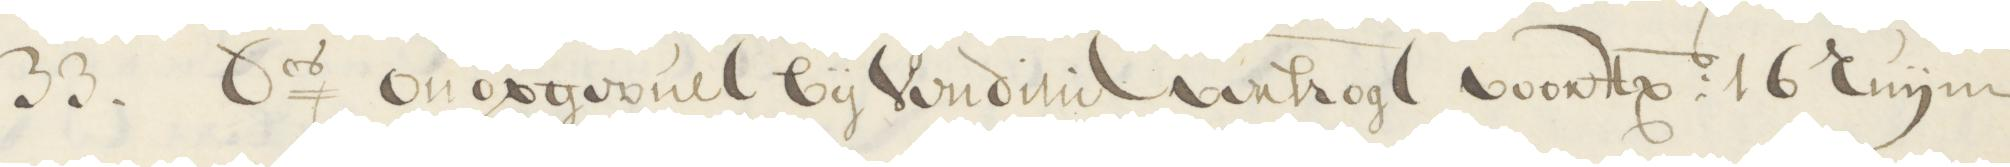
33 „ d=os onopgevult bij venditie verkogt voor Rx:s 16 ruijm
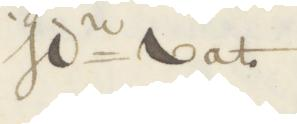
jd=e vat
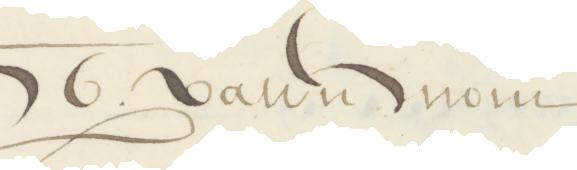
16. vaten mom
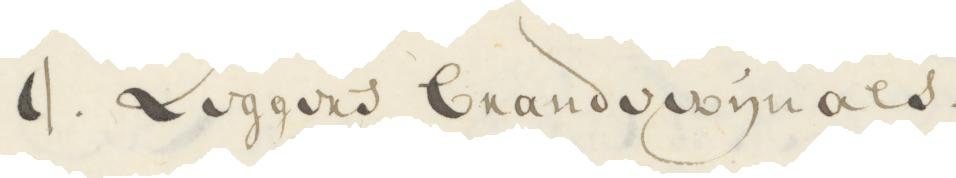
4: Leggers brandewijn als
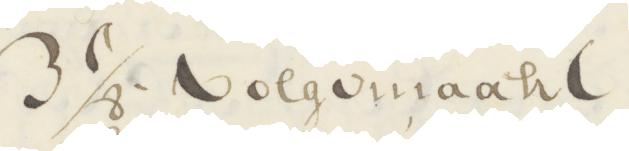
3 5/8. volgemaakt
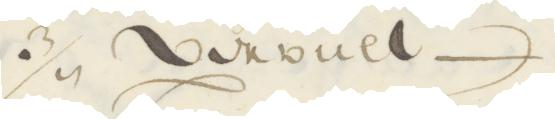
¾ vervult
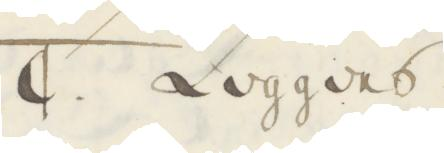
4. Leggers
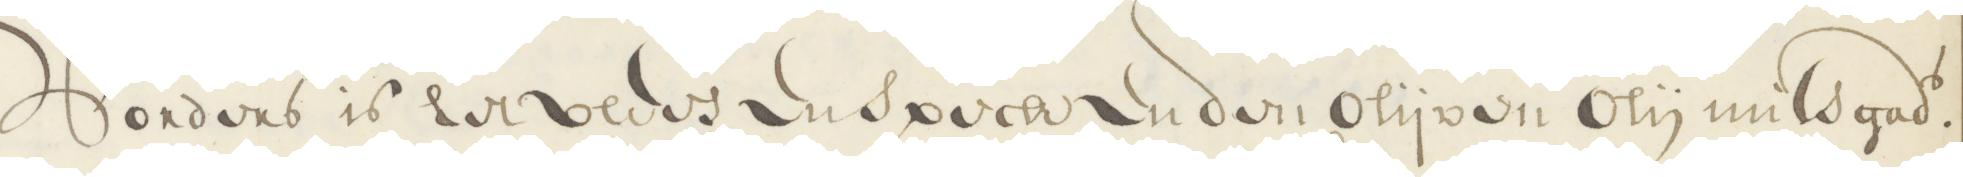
Vorders is het vlees en speck en den olijven olij mitsgad.s
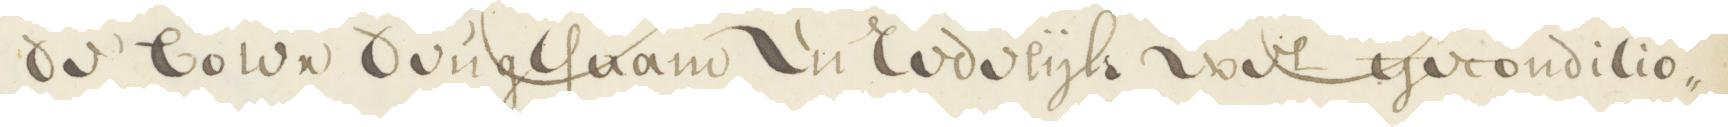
de boter deugtsaam en redelijk wel geconditio„
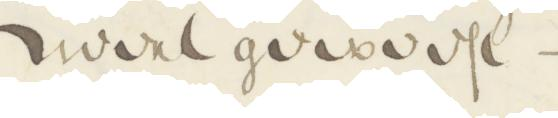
neert geweest
